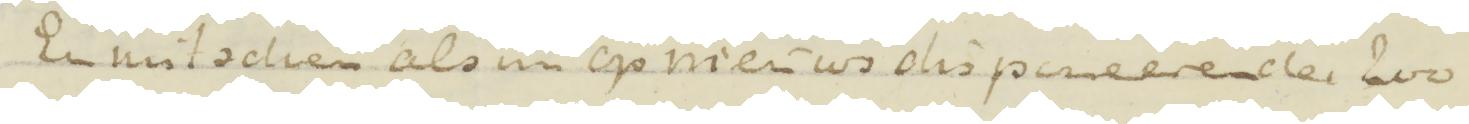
En mitsdien als nu op nieuws disponeerende, zoo
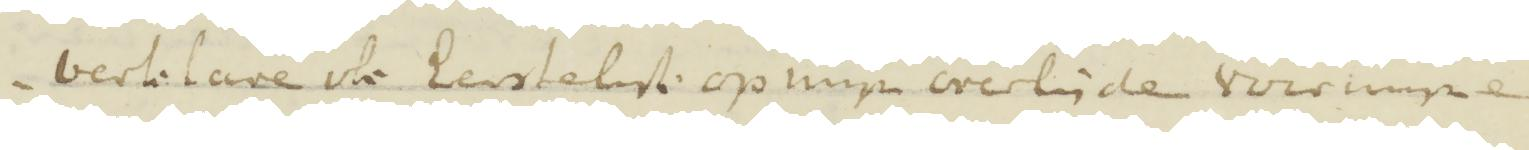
verklare ik Eerstelyk op myn overlijden voor myne
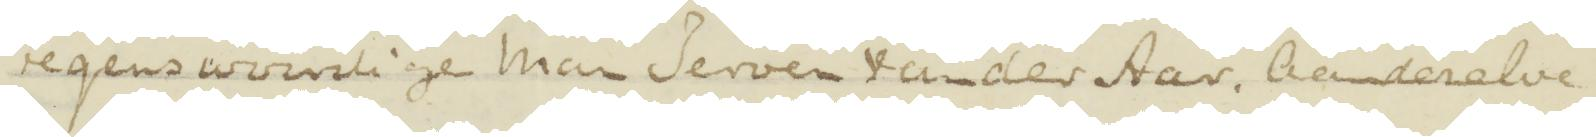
tegenswoordige man Jeroen van der Aar, Aan dezelve
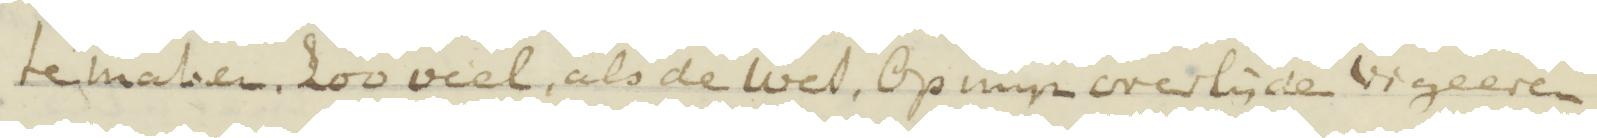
te maken, zoo veel, als de wet, Op myn overlijden vigeeren
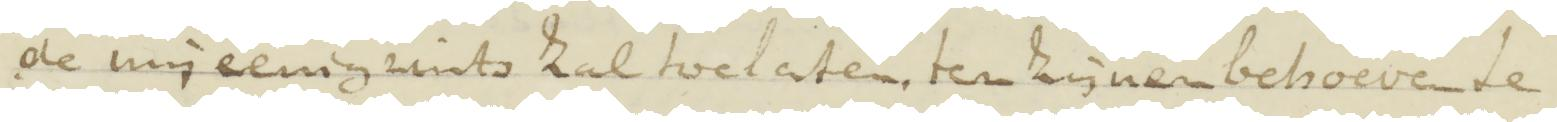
„de mij eenigzints zal toelaten, ten zijnen behoeven te
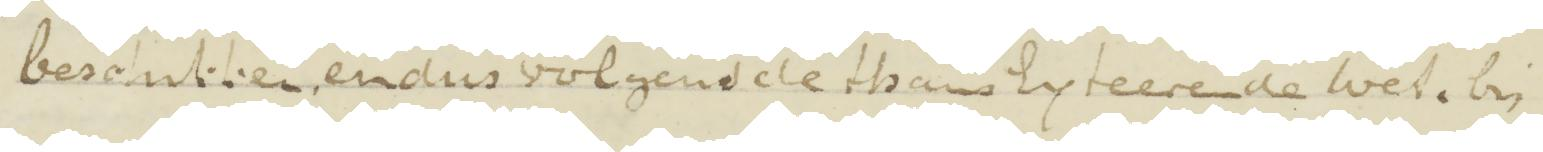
beschikken, en dus volgend de thans Exteerende wet, bij
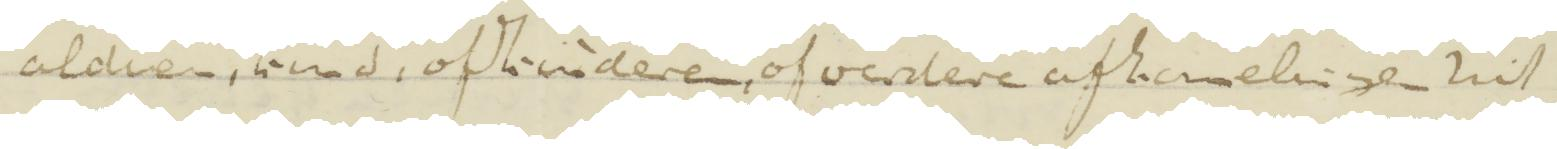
aldien, kind, of kinderen, of verdere afkomelingen uit
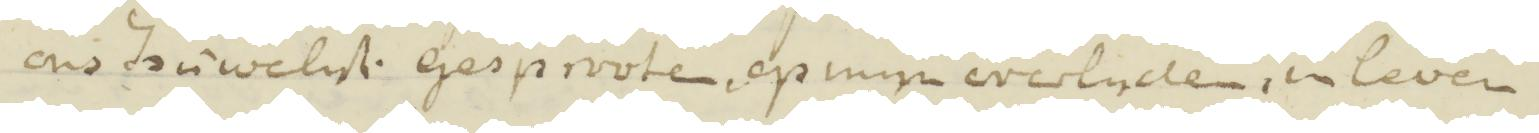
ons huwelijk gesprooten, op myn overlyden, in leven
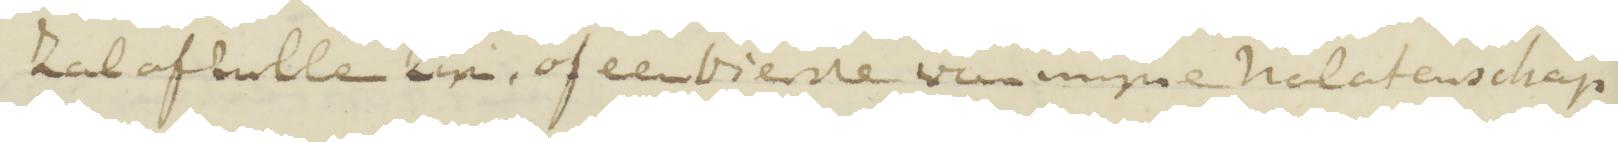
zal of zullen zyn, of een vierde van myne nalatenschap
